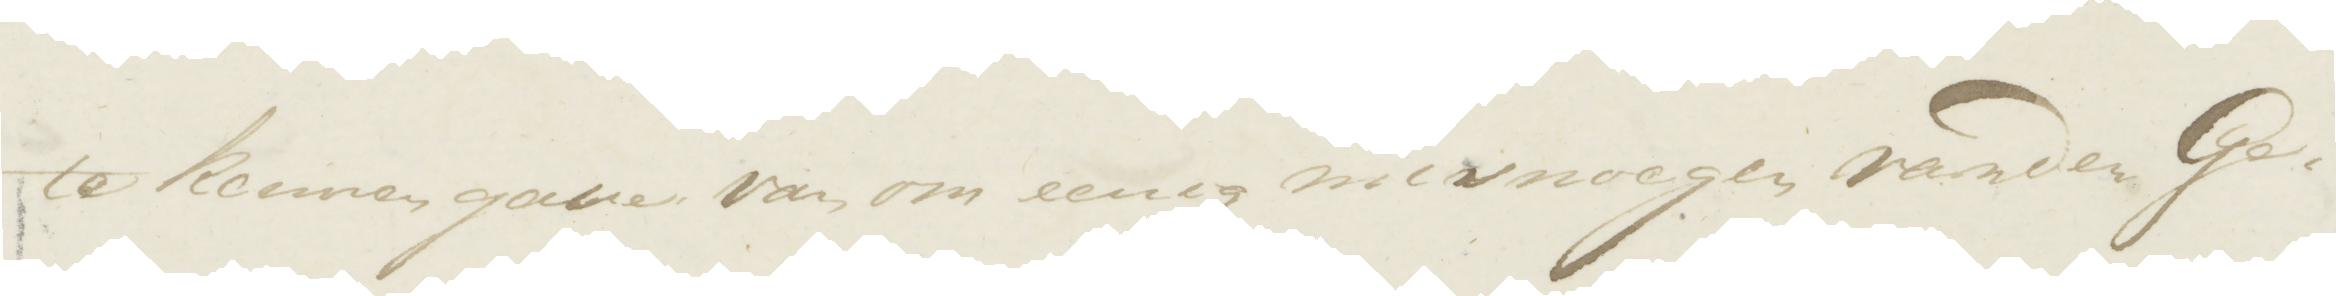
te kennen gaven van om eenig misnoegen van den Ge„
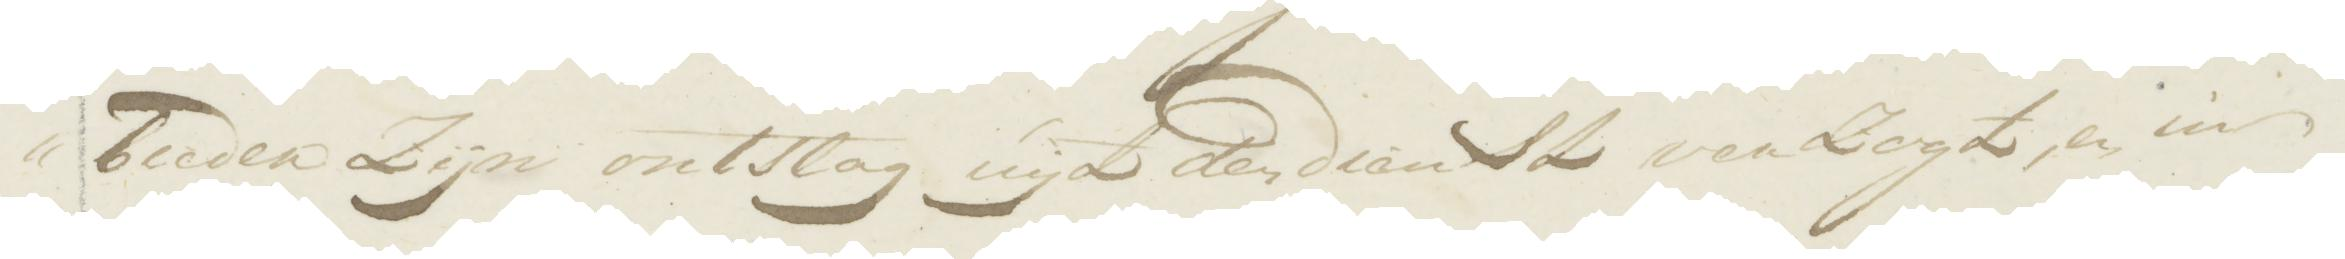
„bieder zijn ontslag uijt den dienst verzogt, en in
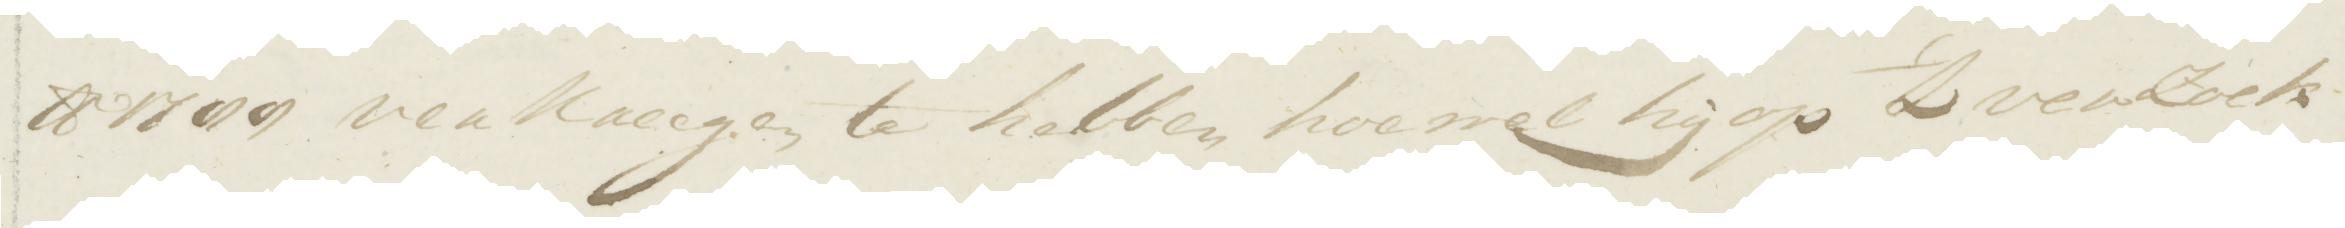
A 1788 verkreegen te hebben hoewel hij op 't verzoek
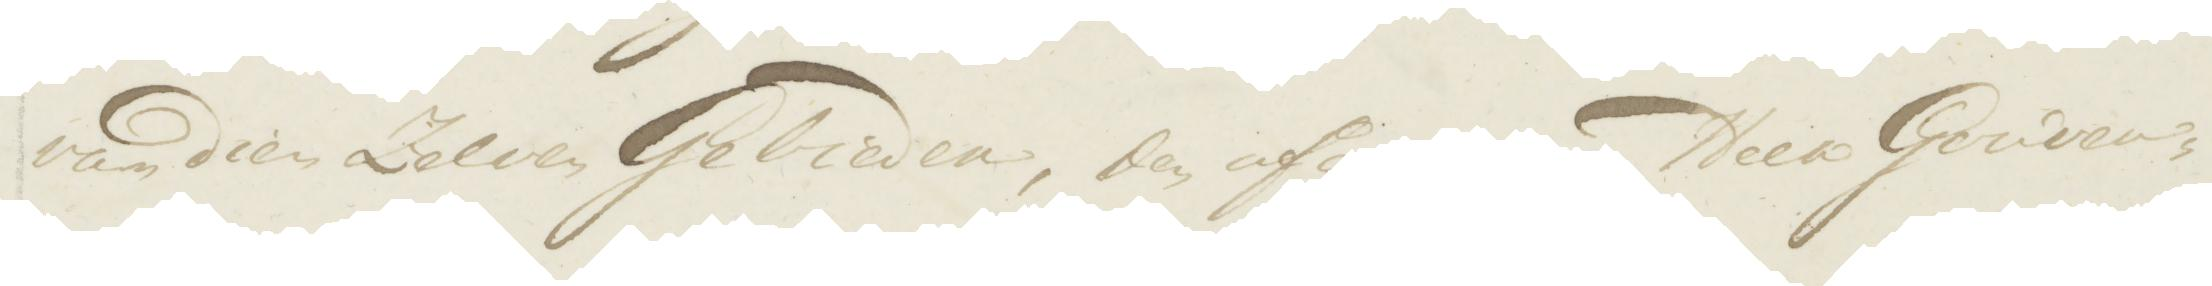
van dien zelven Gebieder, den afgegane Heer Gouver„
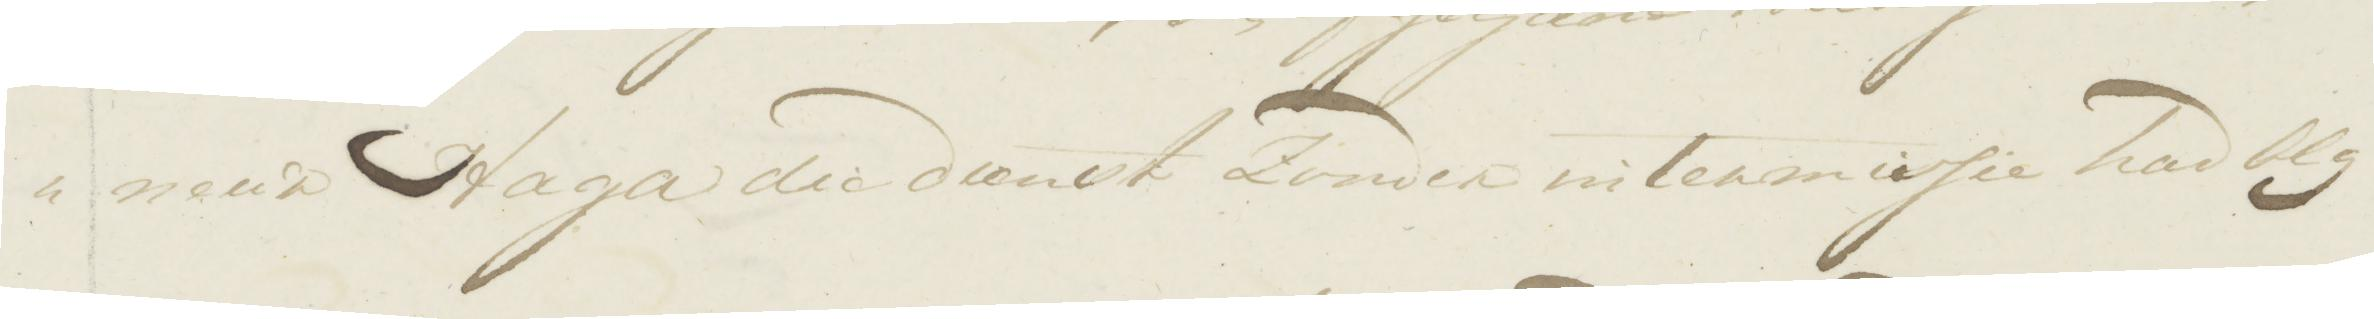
„ neur Haga die dienst zonder intermissie had bly
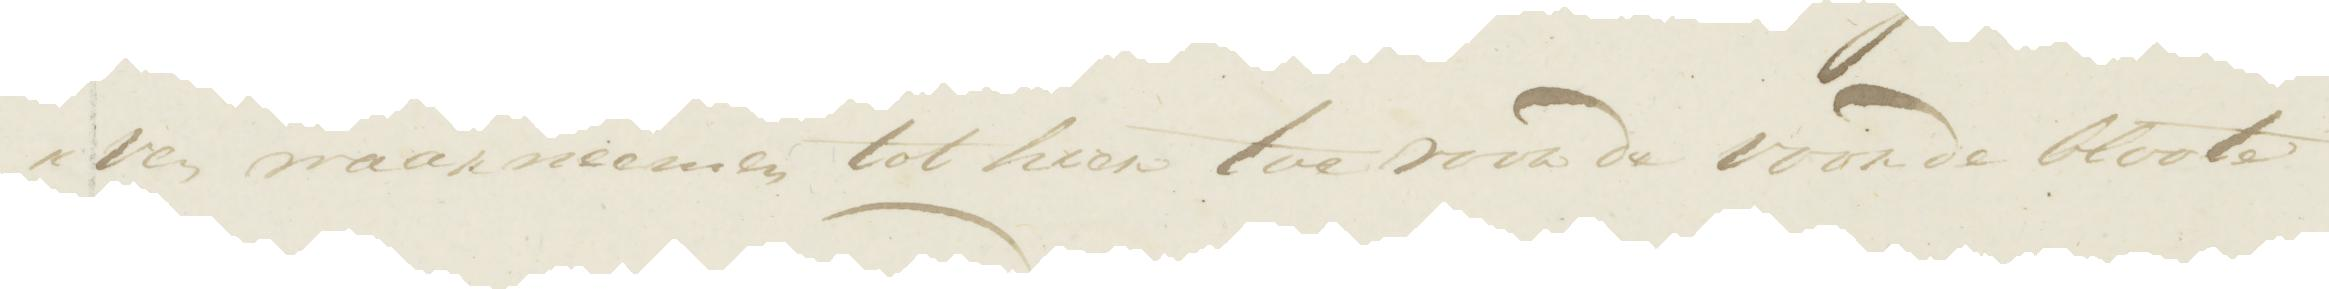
„ven waarneemen tot hier toe voor de voor de bloote
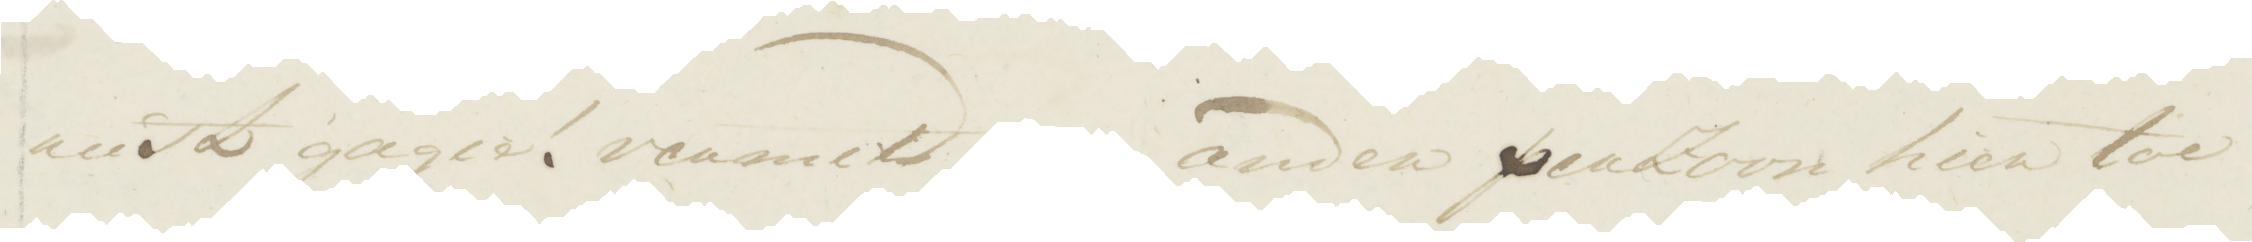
rust gagie vermeld geen ander perzoon hier toe
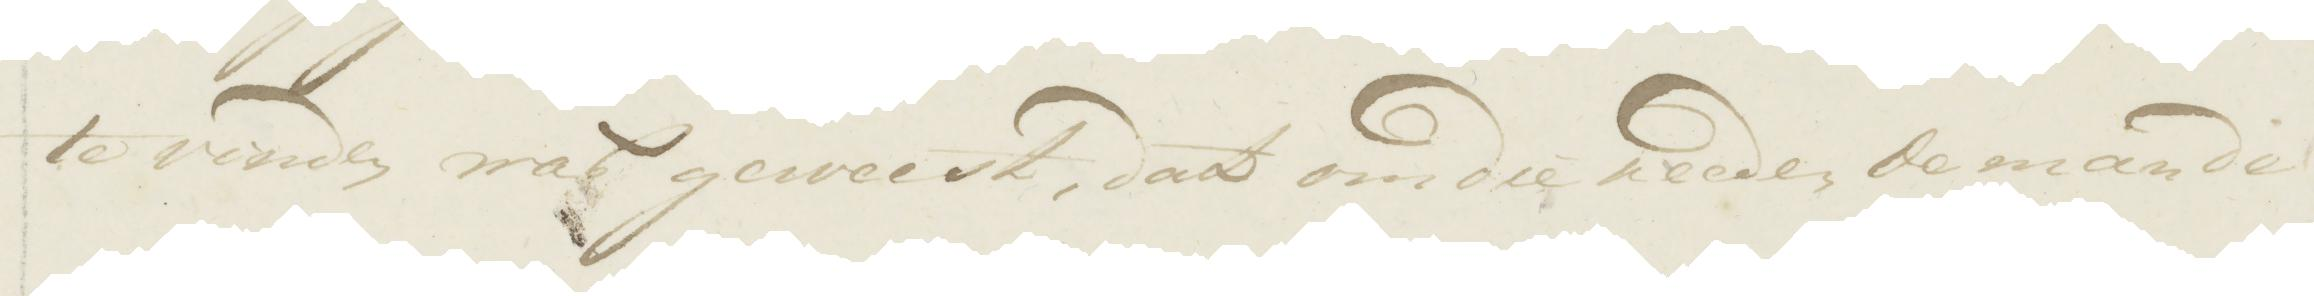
te vinden was geweest, dat om die reeden de man de
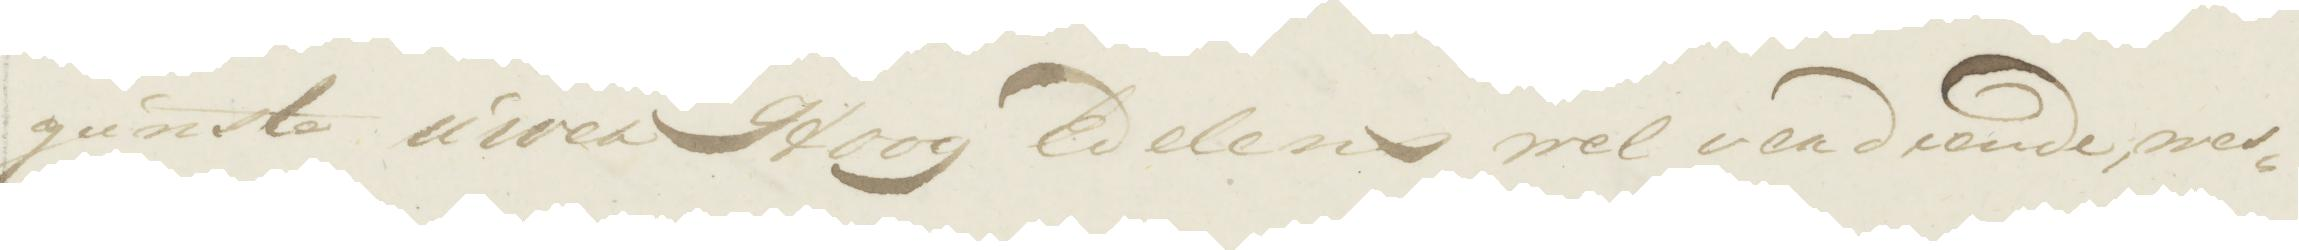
gunste uwer Hoog Edelens wel verdiende, wes„
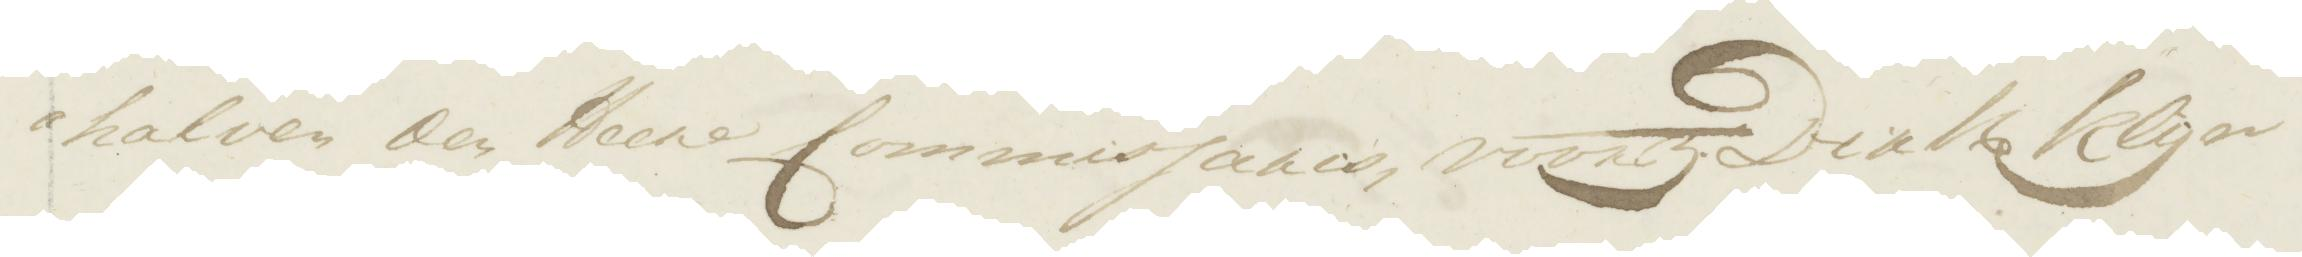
„halven den Heere Commissaris, voorsz. Dirk Klijn
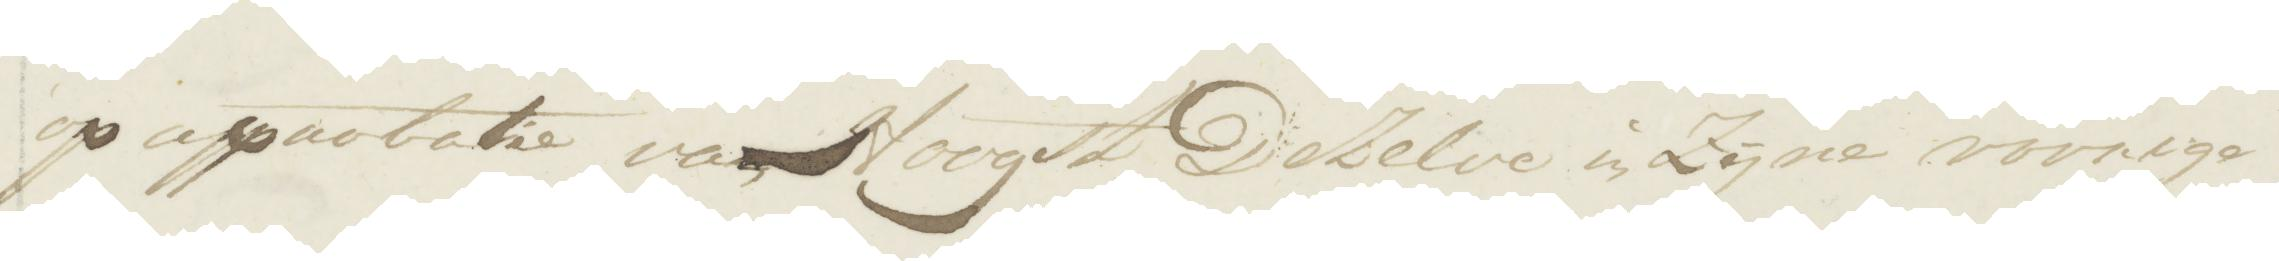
op approbatie van Hoogst Dezelve in zijne voorige
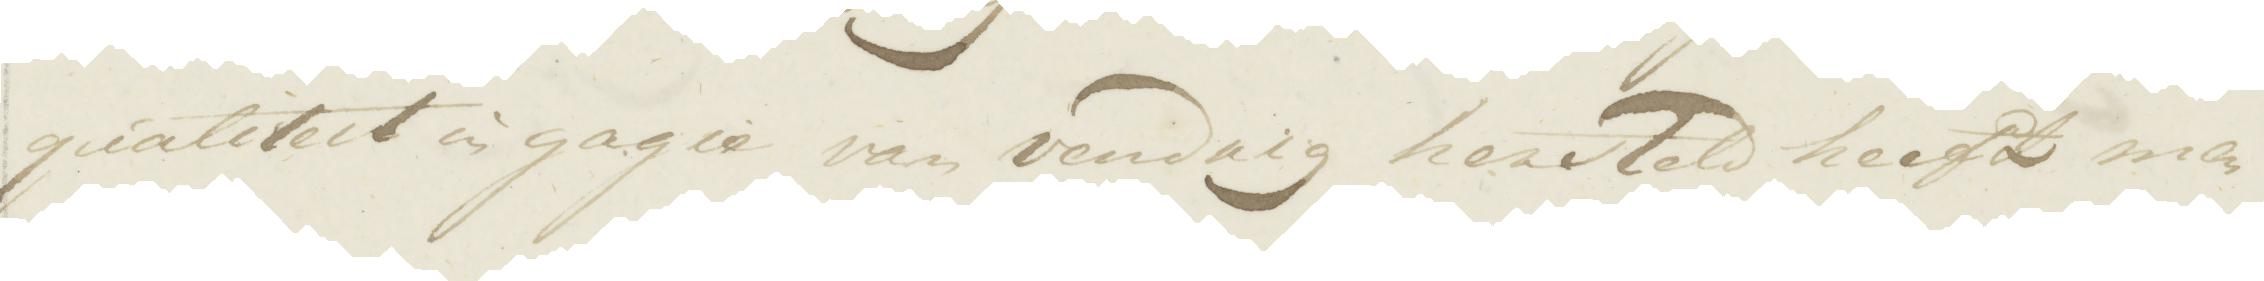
qualiteit in gagie van vendrig hersteld heeft men
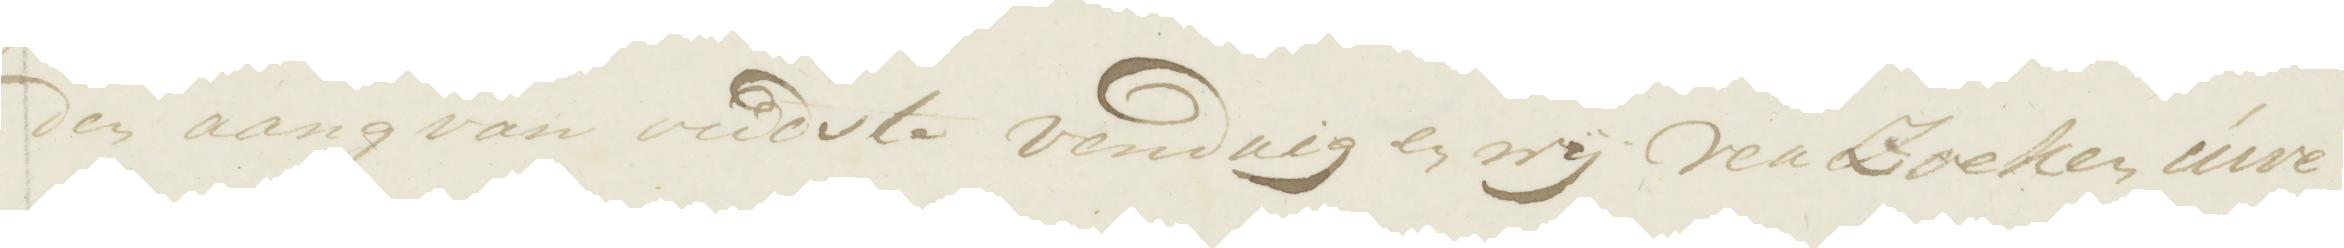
den rang van oudste vendrig en wij verzoeken uwe
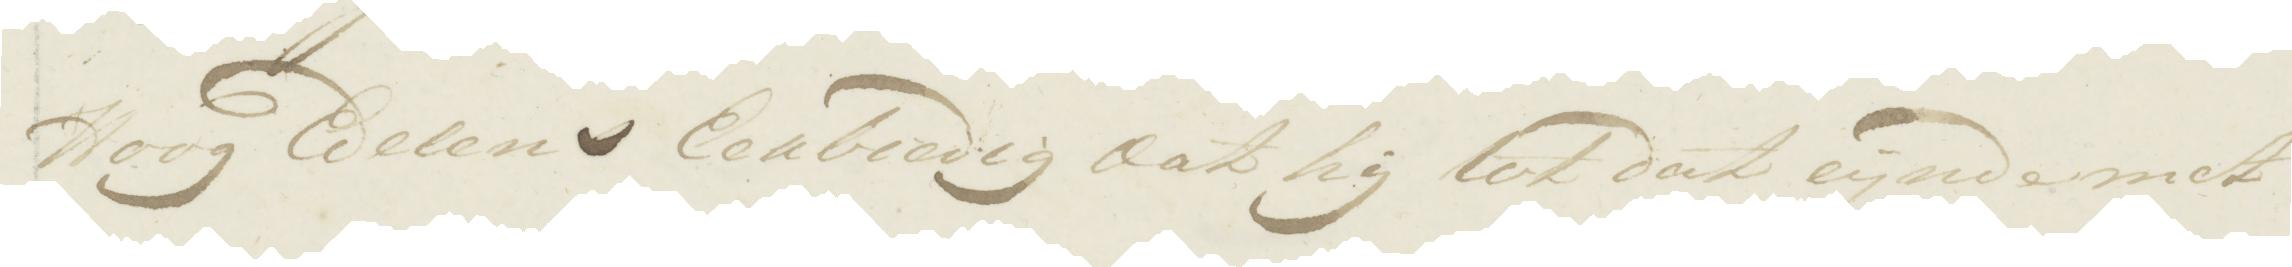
Hoog Edelens Eerbiedig dat hij tot dat eijnde met
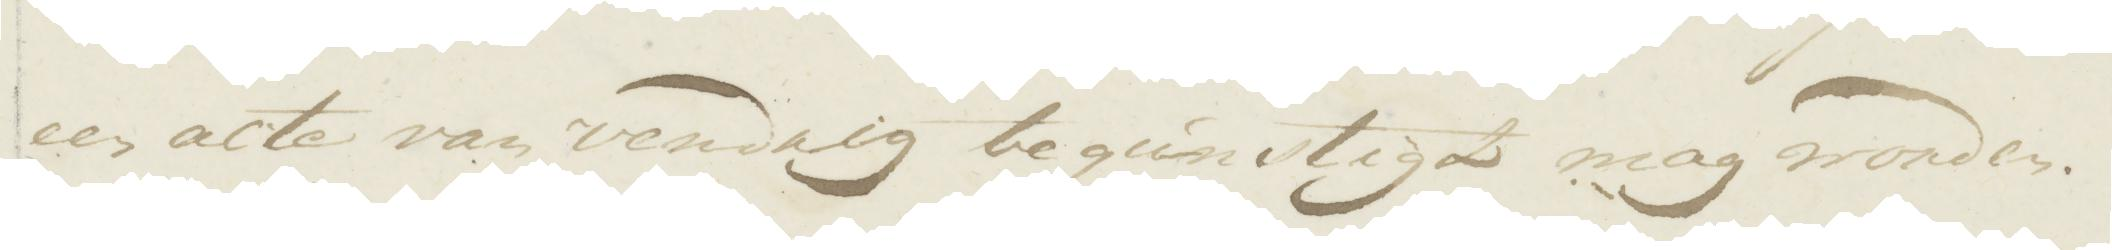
een acte van vendrig begunstigt mag worden.
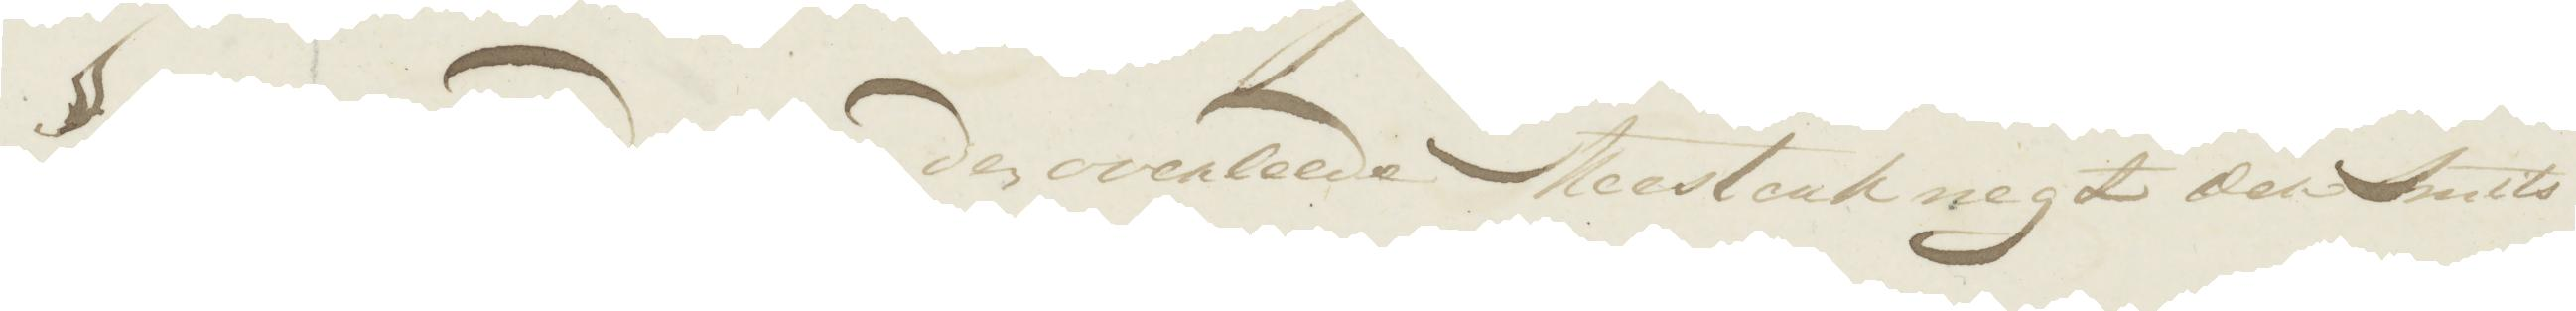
§ 239 Jnsteede van den overleede Meesterknegt der Smits
